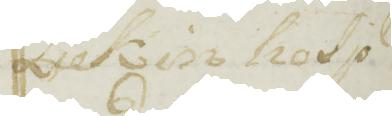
Ziek in hosp
